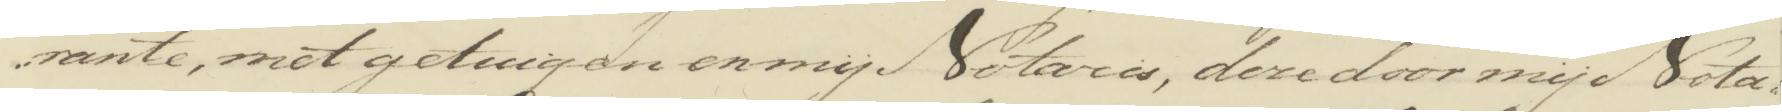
„rante, met getuigen en mij Notaris, deze door mij Nota
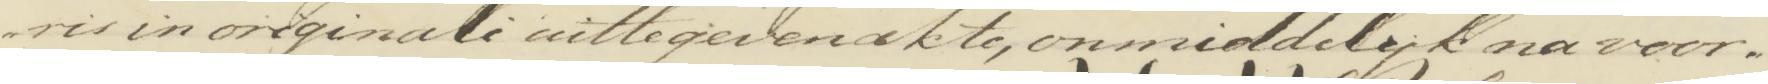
„ris in originali uittegeven akte, onmiddelijk na voor„
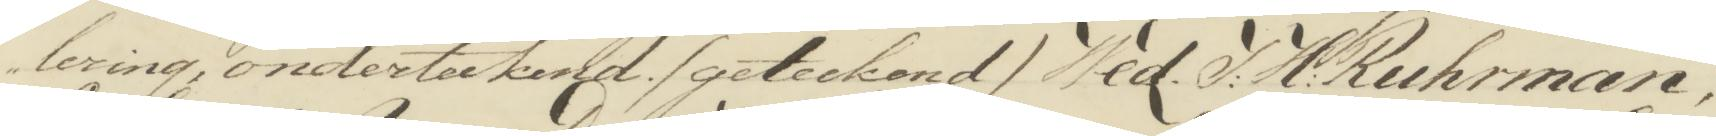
„lezing, onderteekend. /geteekend/ Wed. I: H: Ruhrman
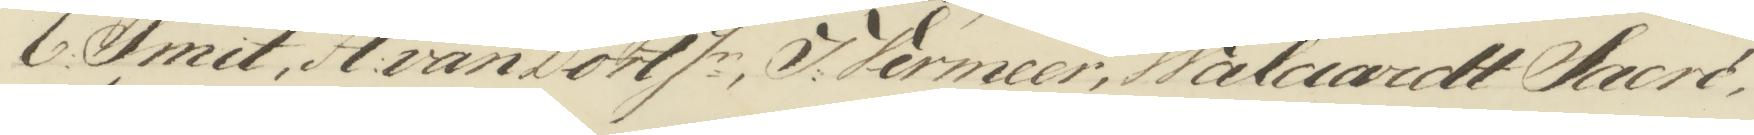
C: Smit, A: van Dort J=r, I: Vermeer, Walaardt Sacré,
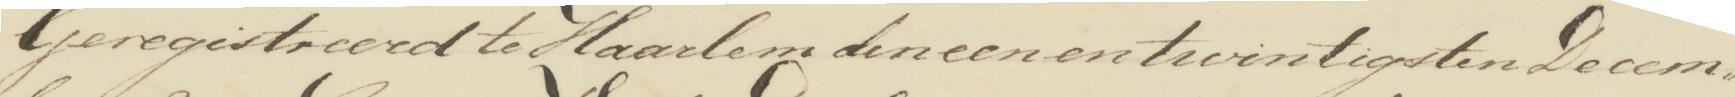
Geregistreerd te Haarlem den een en twintigsten Decem
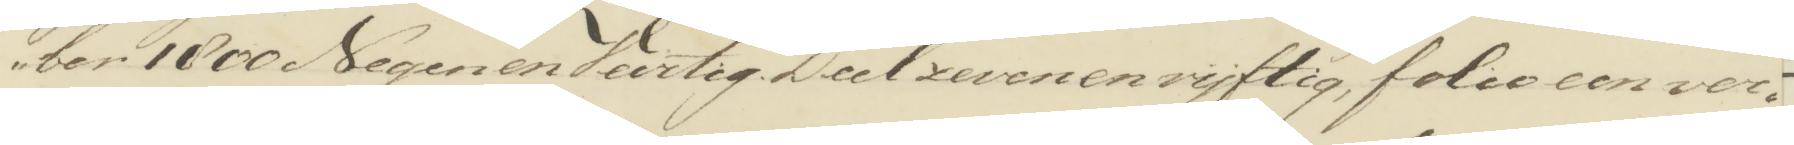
„ber 1800 Negen en Veertig Deel zeven en vijftig, folio een ver„
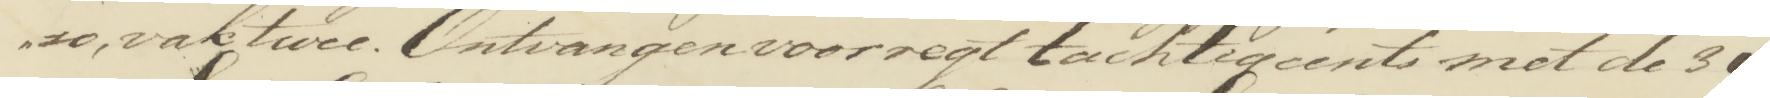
„so, vak twee. Ontvangen voor regt tachtig cents met de 38
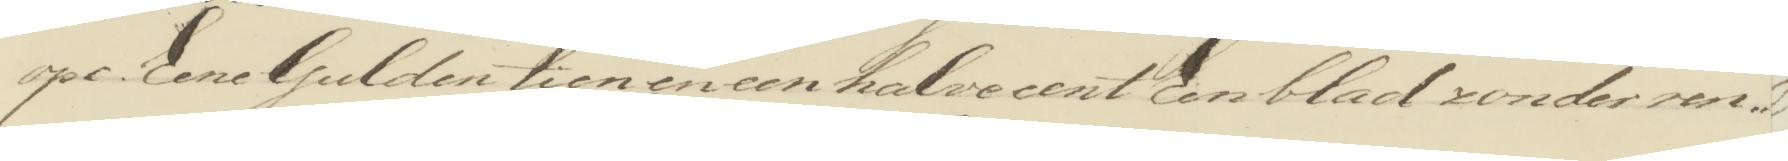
opc. Eene Gulden tien en een halve cent Een blad zonder ren„
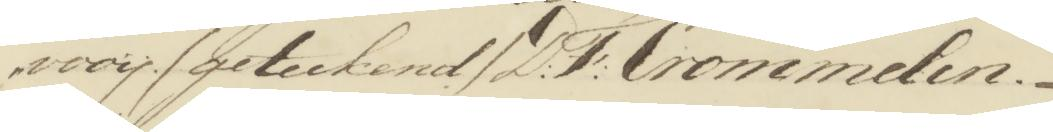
vooij. / geteekend / D:F: Crommelin.
